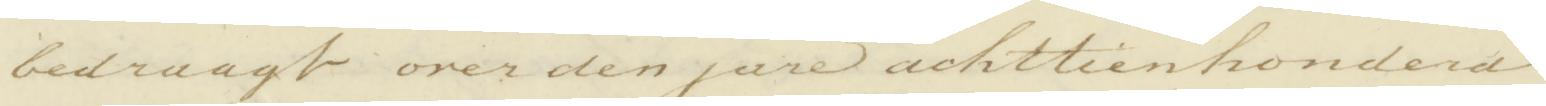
bedraagt over den jare achttienhonderd
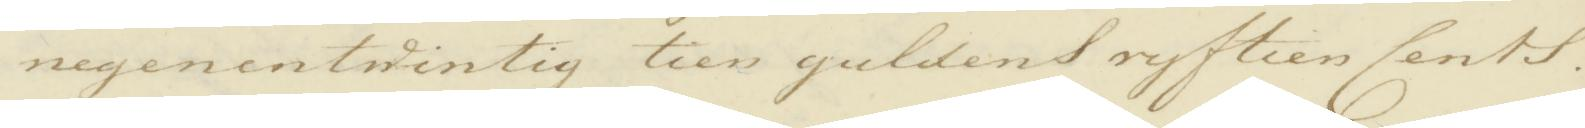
negen entwintig tien guldens vyftien Cents.
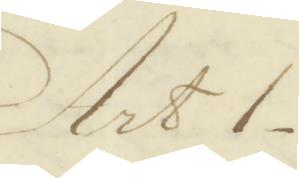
Art1.
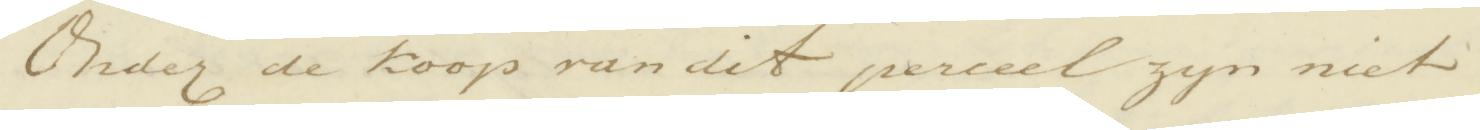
Onder de koop van dit perceel zyn niet
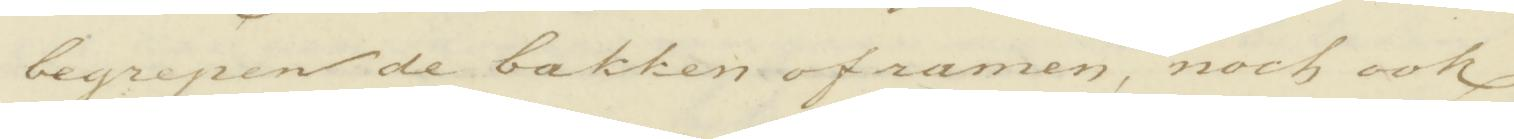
begrepen de bakken of ramen, noch ook
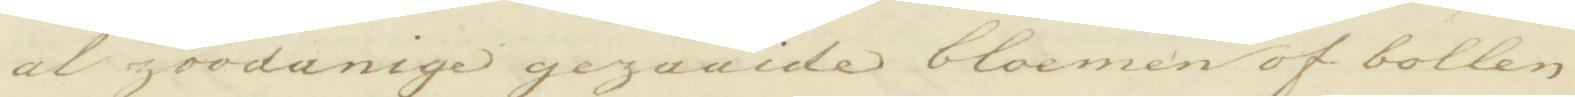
al zoodanige gezaaide bloemen of bollen
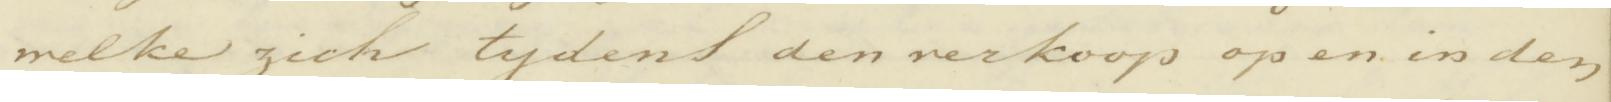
welke zich tydens den verkoop op en in den
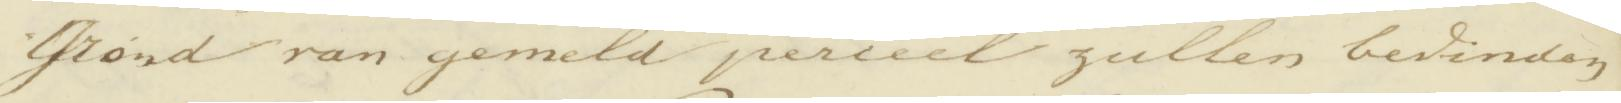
Grond van gemeld perceel zullen bevinden
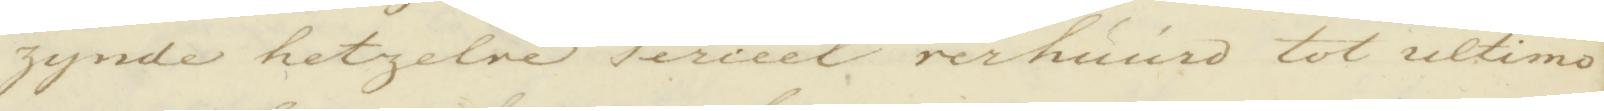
zynde hetzelve Perceel verhuurd tot ultimo
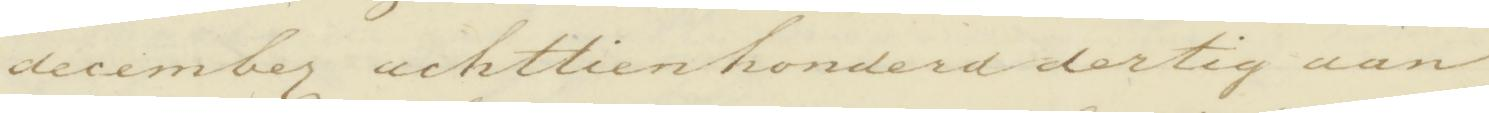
december achttien honderd dertig aan
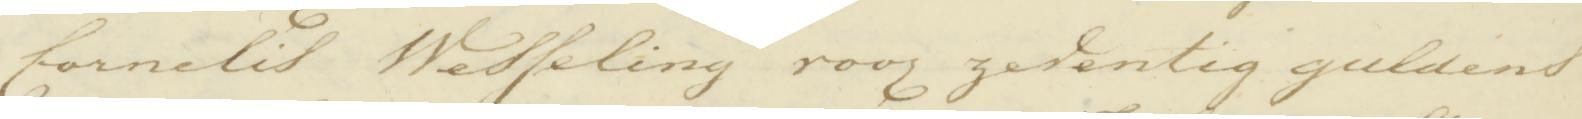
Cornelis Wesseling voor zeventig guldens
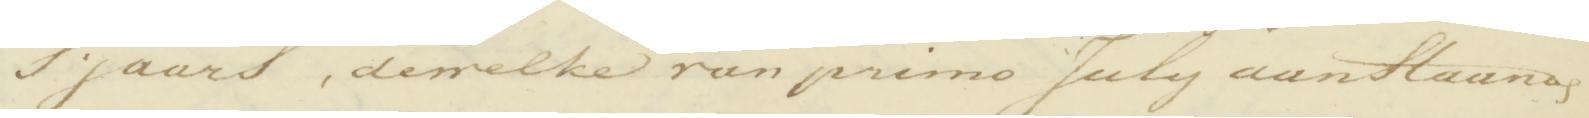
S jaars, dewelke van primo July aanstaande
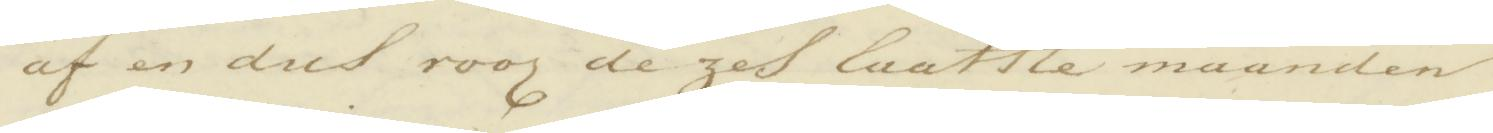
af en dus voor de zes laatste maanden
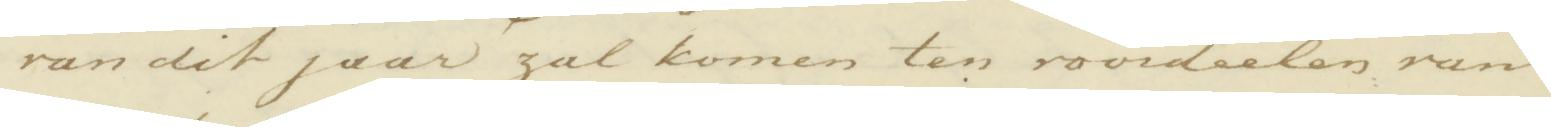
van dit jaar zal komen ten voordeelen van
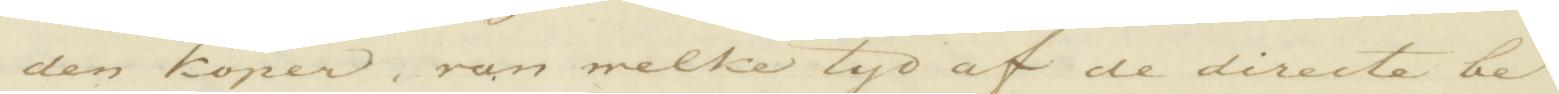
den koper, van welke tyd af de directe be
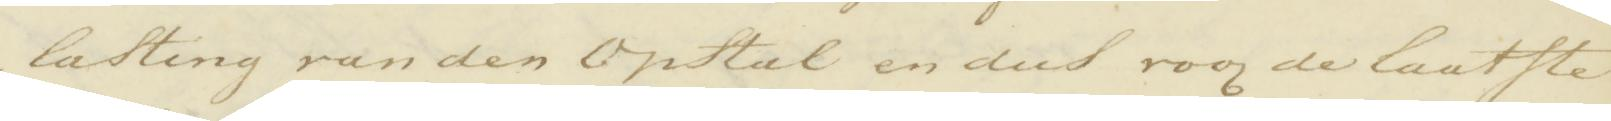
„lasting van den Opstal en dus voor de laatste
